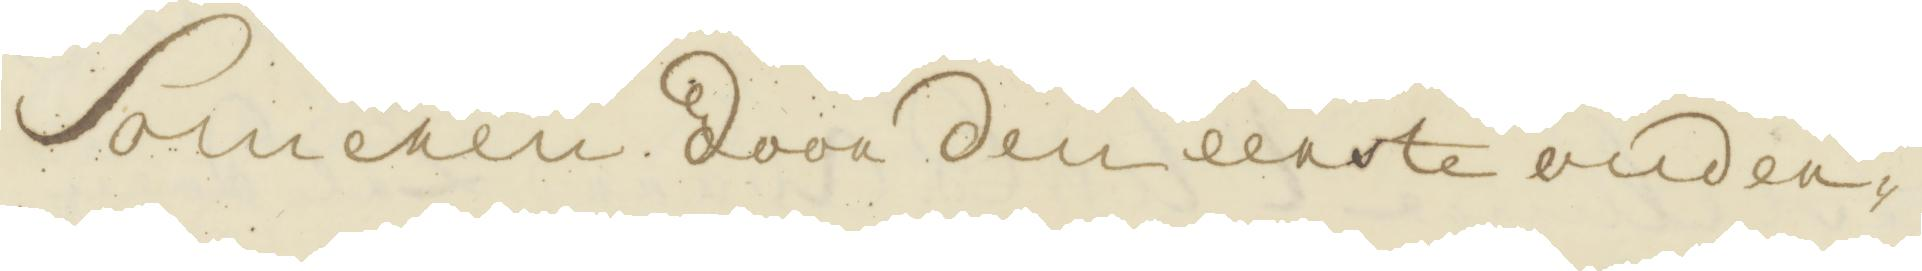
someren door den eerste onder„
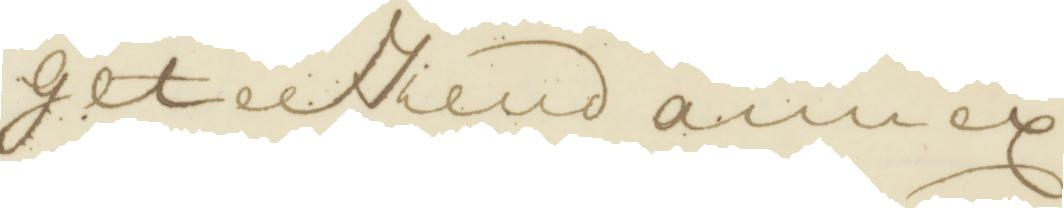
geteekend annex
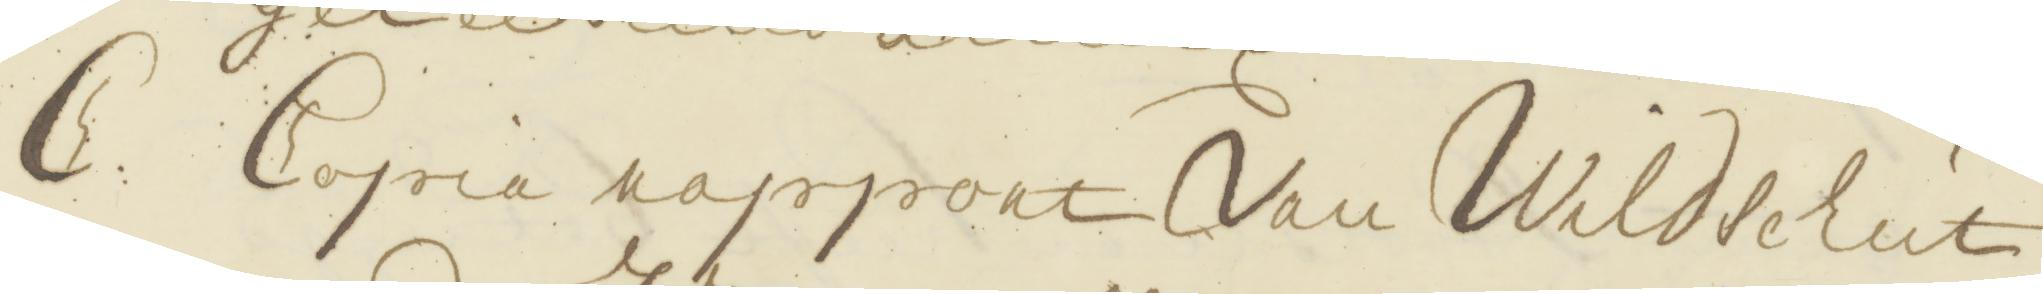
C: Copia rapport van Wildschut
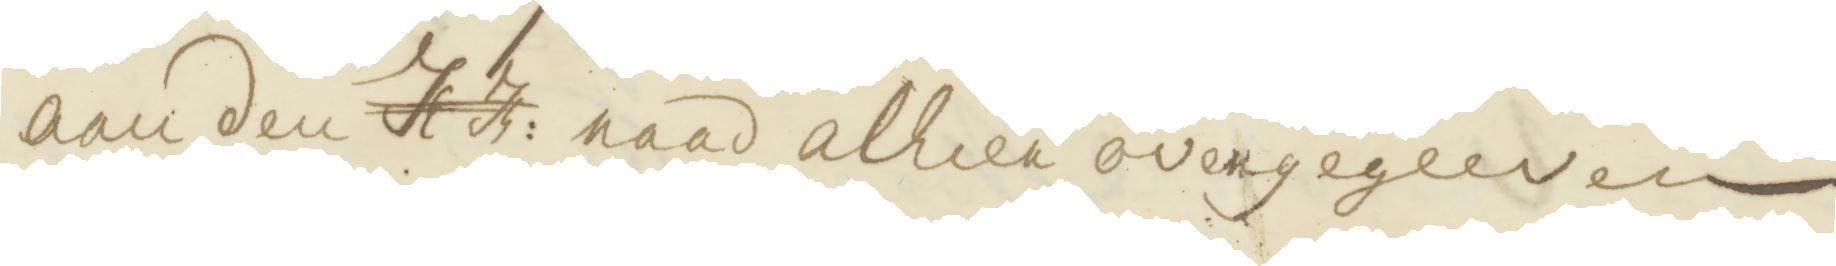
aan den kk: raad alhier overgegeeven
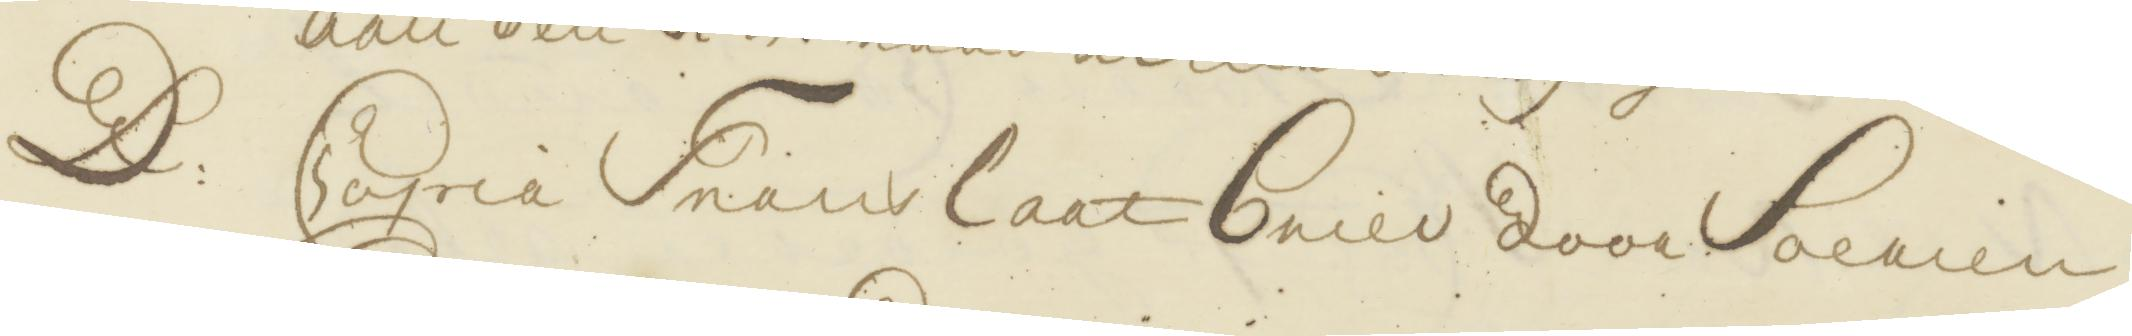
D: Copia Translaat briev door soerien
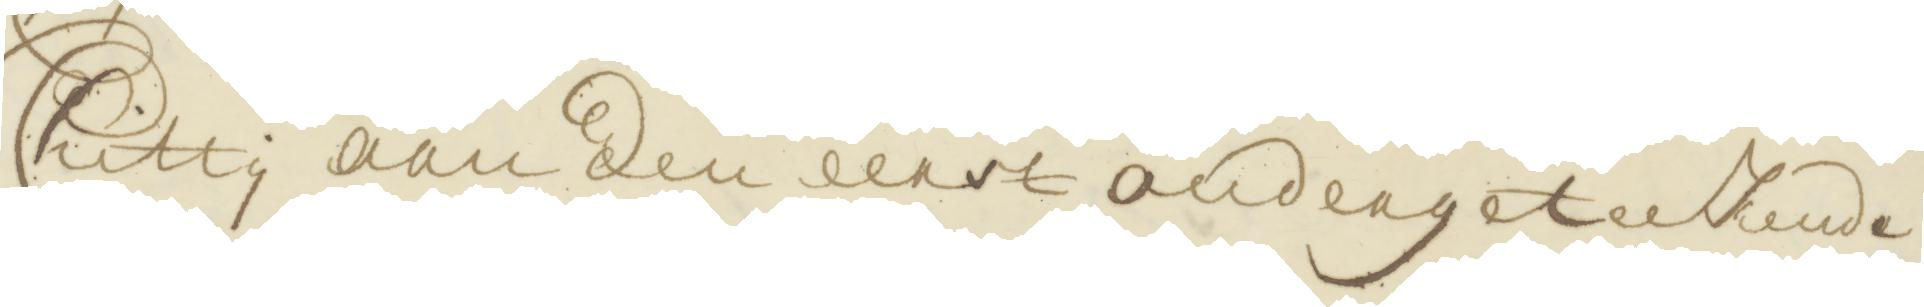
Chittij aan den eerst ondergeteekende
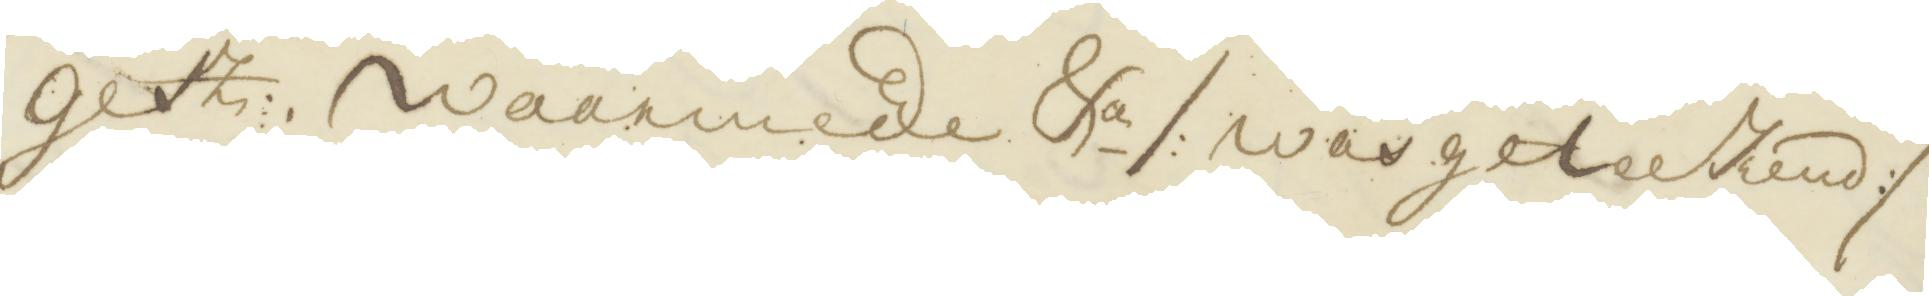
gesz:, waarmede &_a /:was geteekend:/
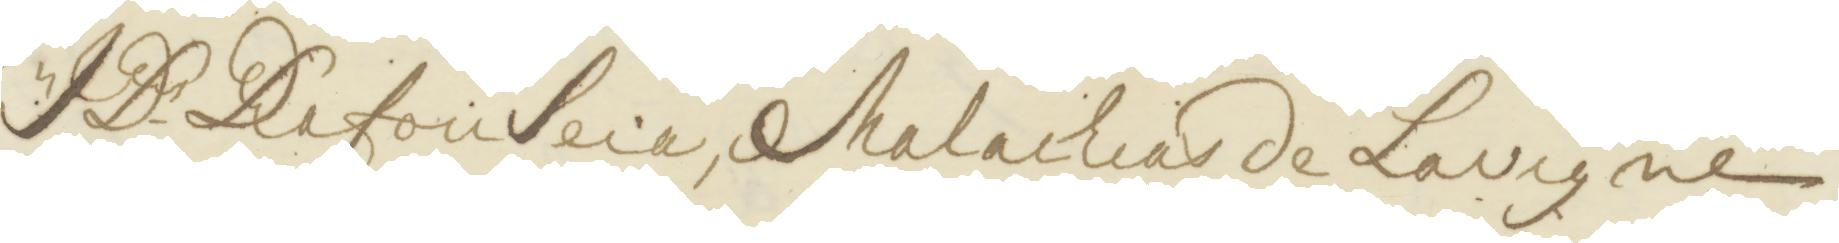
I D Dafouseia, Malachias de Lavigne
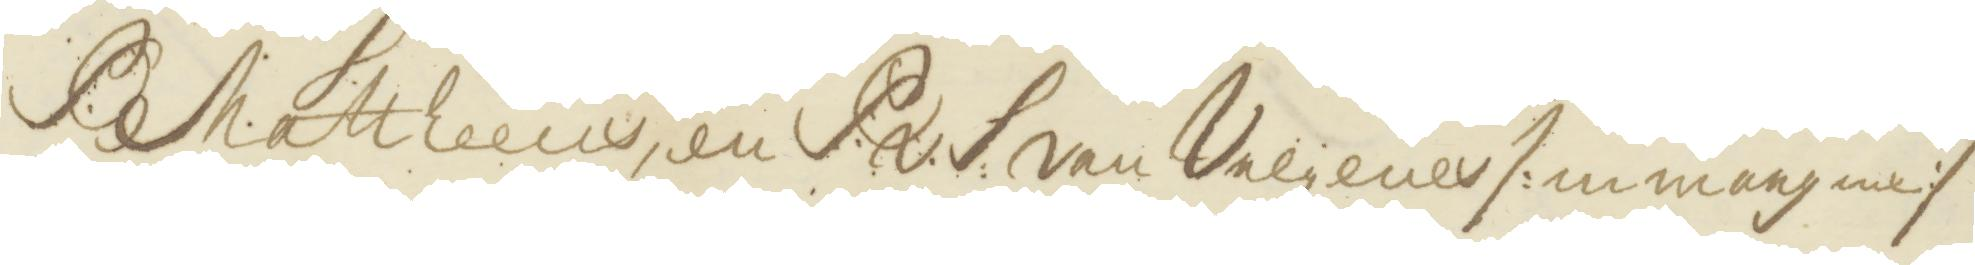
P. Mattheeus, en P: v. s: van Vreijenes /:in margine:/
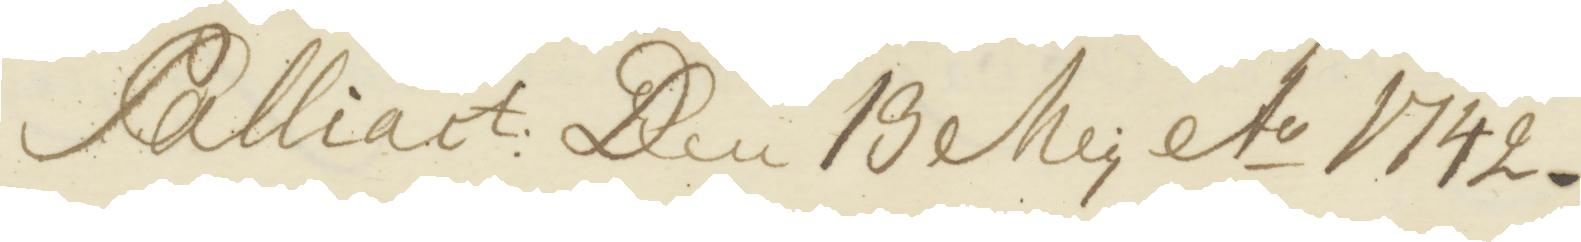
Palliac:t Den 13 Meij A_o 1742–
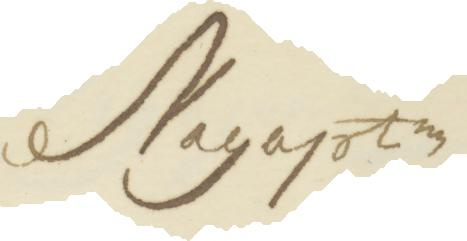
Nagap_tm
